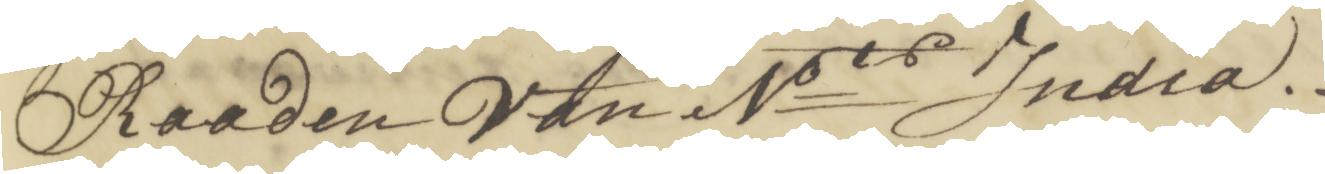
Raaden van N=ts Jndia.
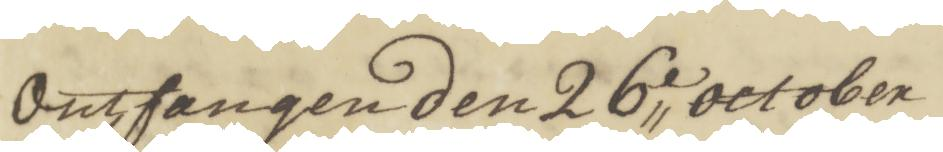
Ontfangen den 26„e october
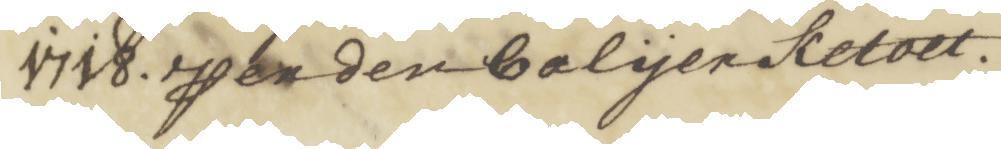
1718. per den balijer ketoet.
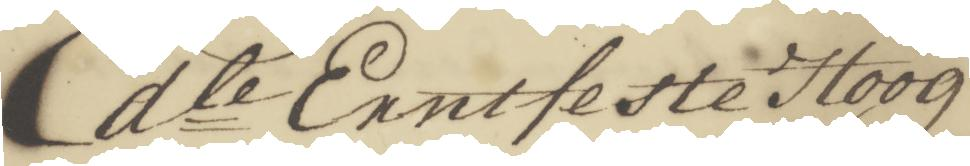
Ed=le Erntfeste Hoog
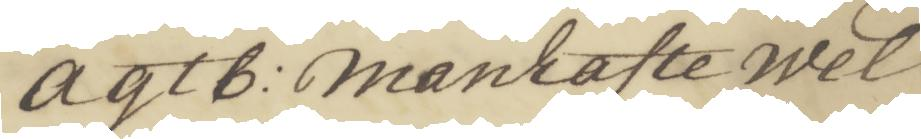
Agtb: manhafte wel
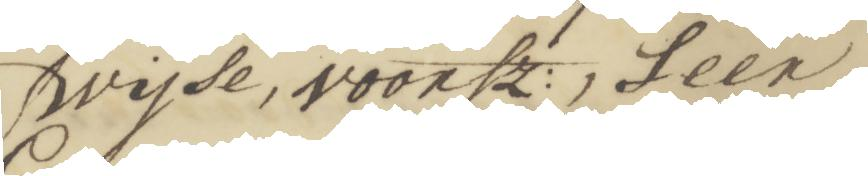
wijse, voorsz:, Seer
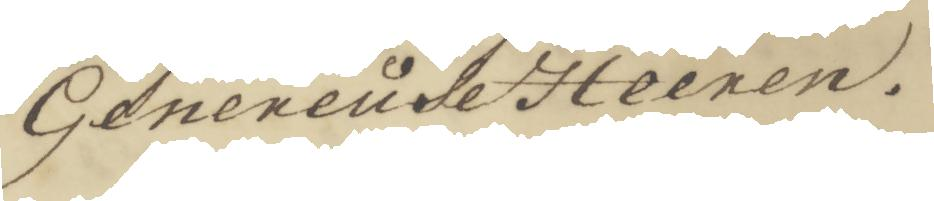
Genereuse Heeren.
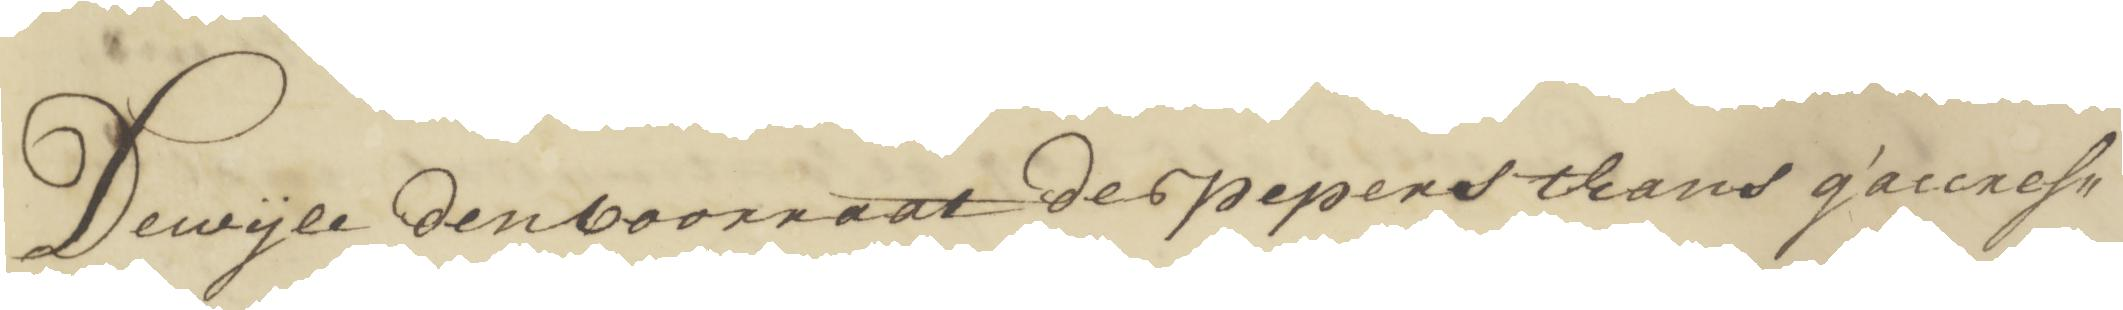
Dewijle den voorraat des pepers thans g'accres„
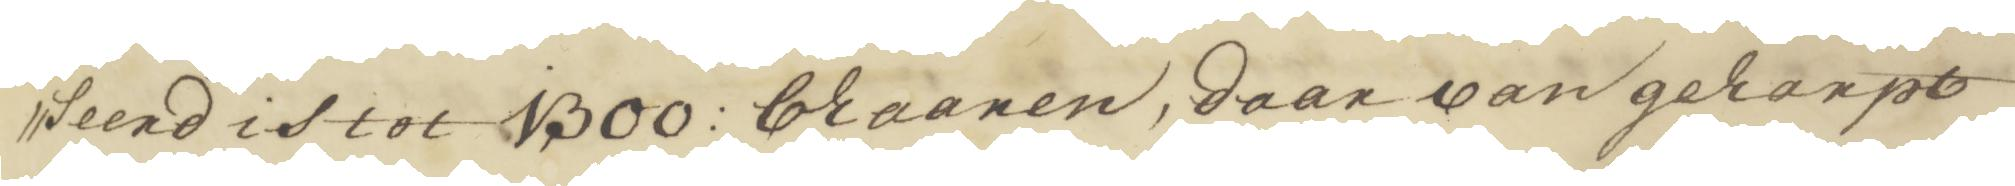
„seerd is tot 1300: bhaaren, daar van geharpt
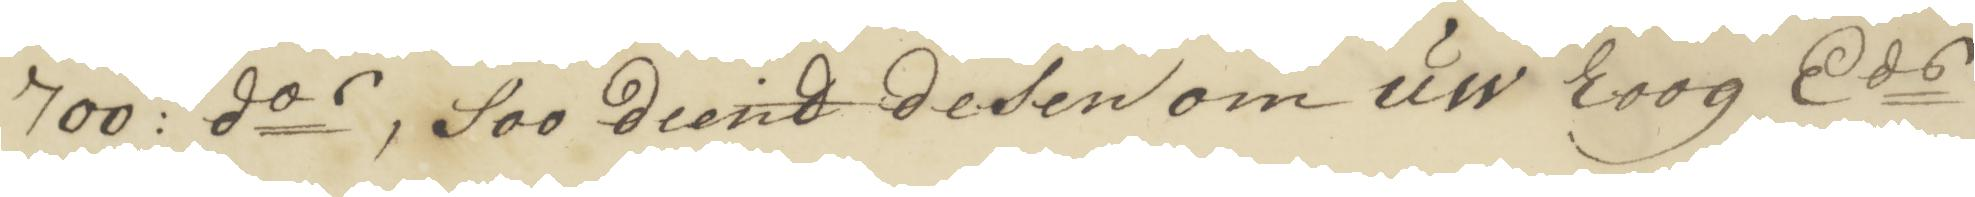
700: d=os, Soo diend desen om uw hoog Ed=s
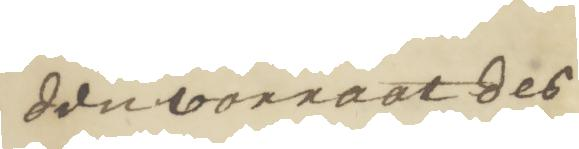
den vorraat des
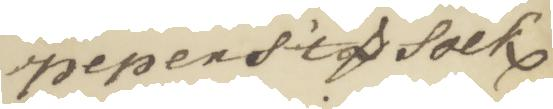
pepers 't versoek
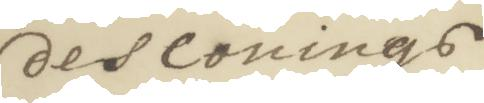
des Conings
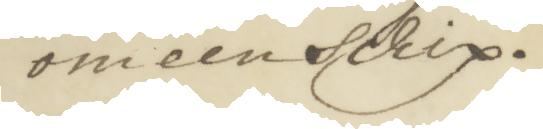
om een Schip.
